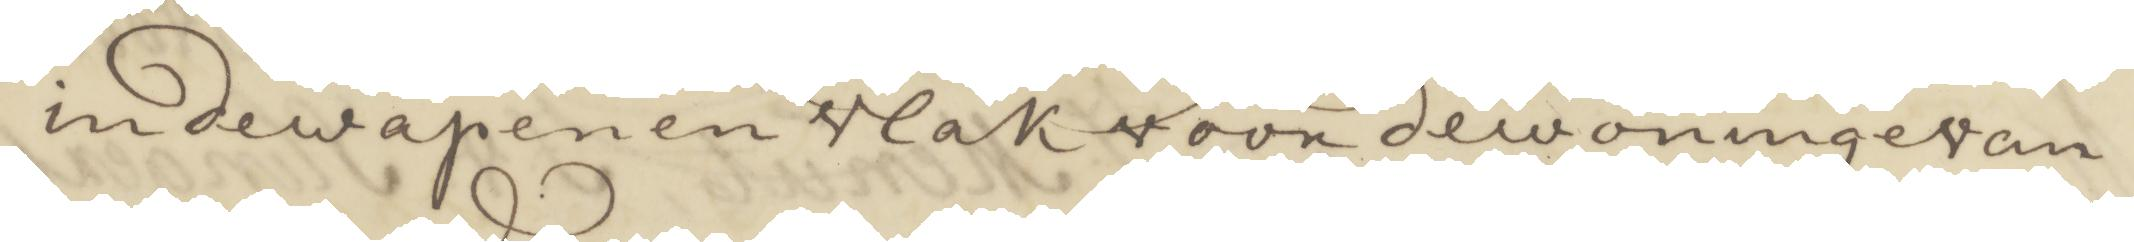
in de wapenen vlak voor de woninge van
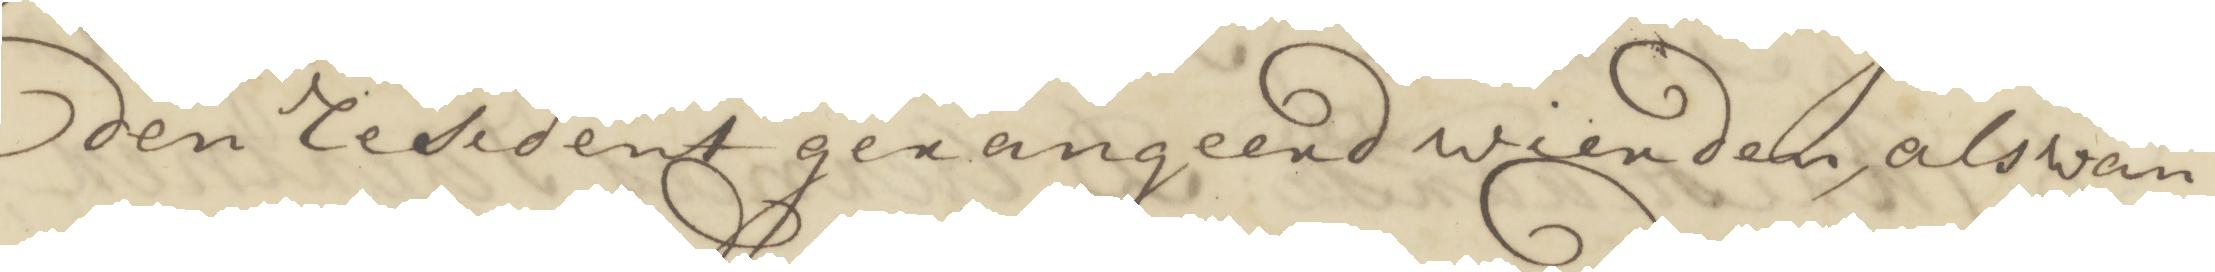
den Resident gerangeerd wierden, als wan
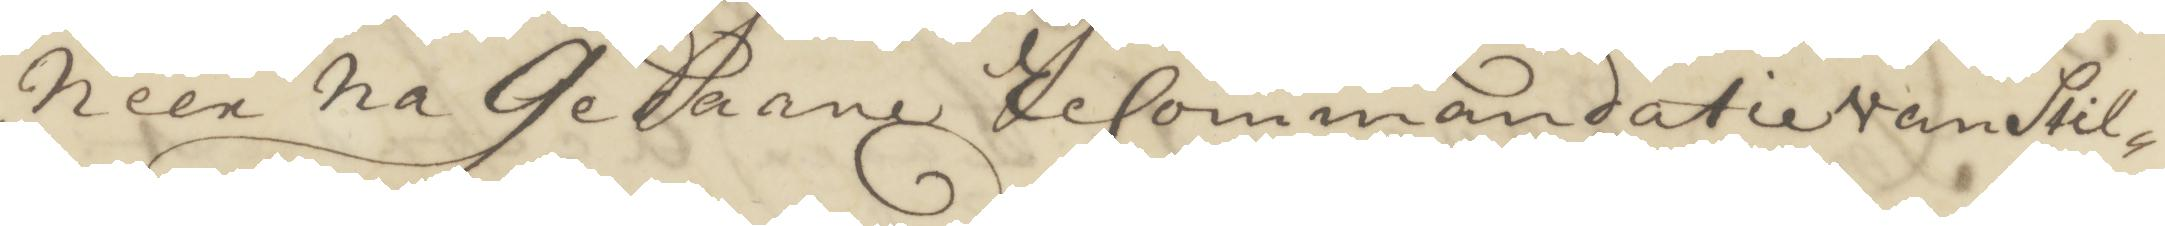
neer na Gedaane Recommandatie van stil„
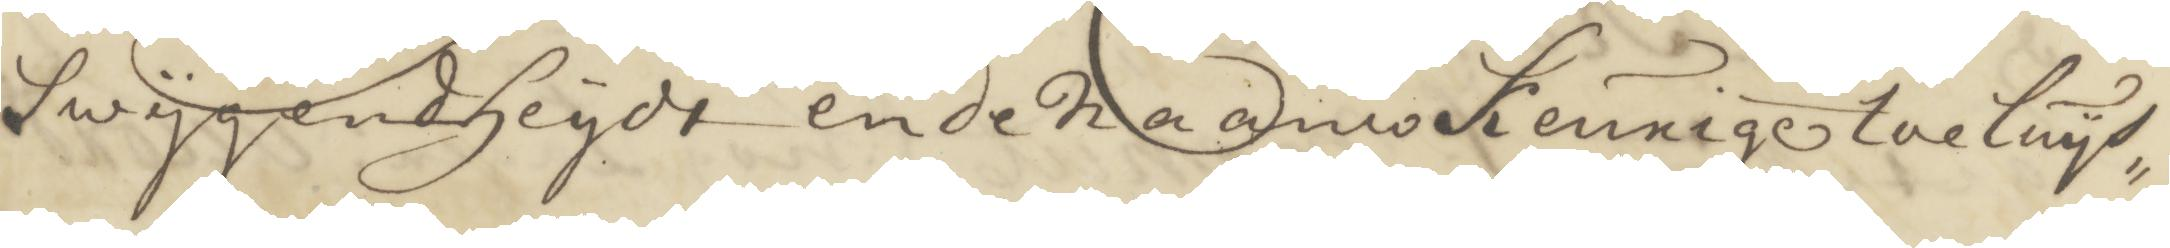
swijgendheijdt en de naauwkeurige toeluijs„
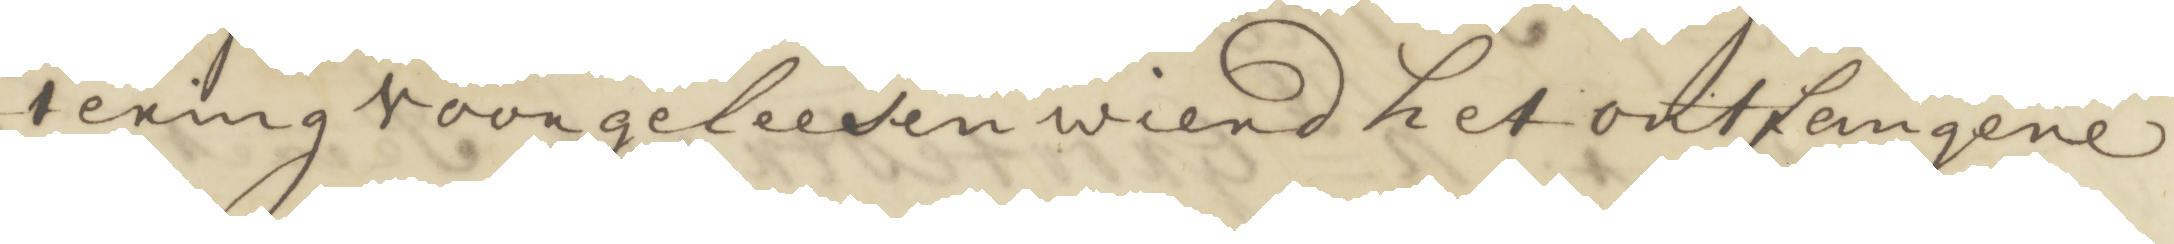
„tering voor geleesen wierd het ontfangene
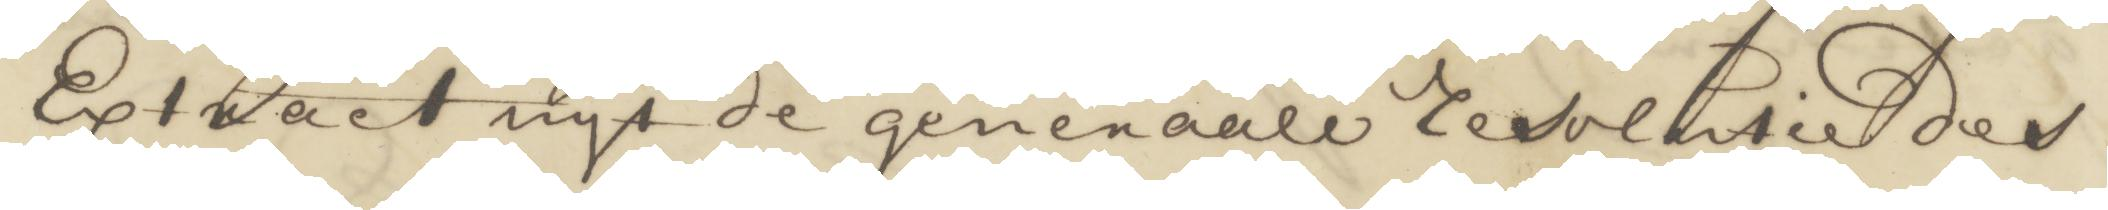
Extract uijt de generaale Resolutie des
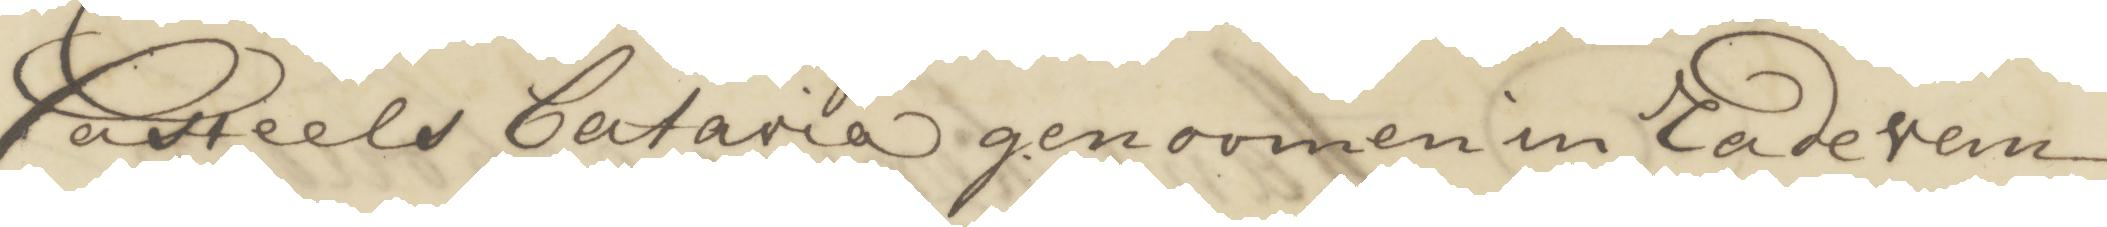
Casteels batavia genoomen in Rade van
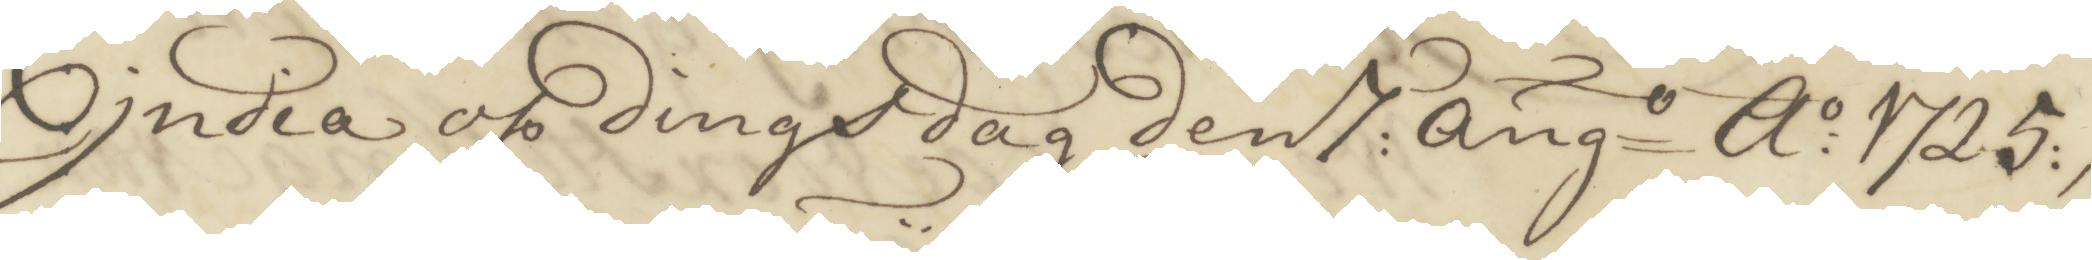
Jndia op dingsdag den 7:' aug=o A:o 1725:,
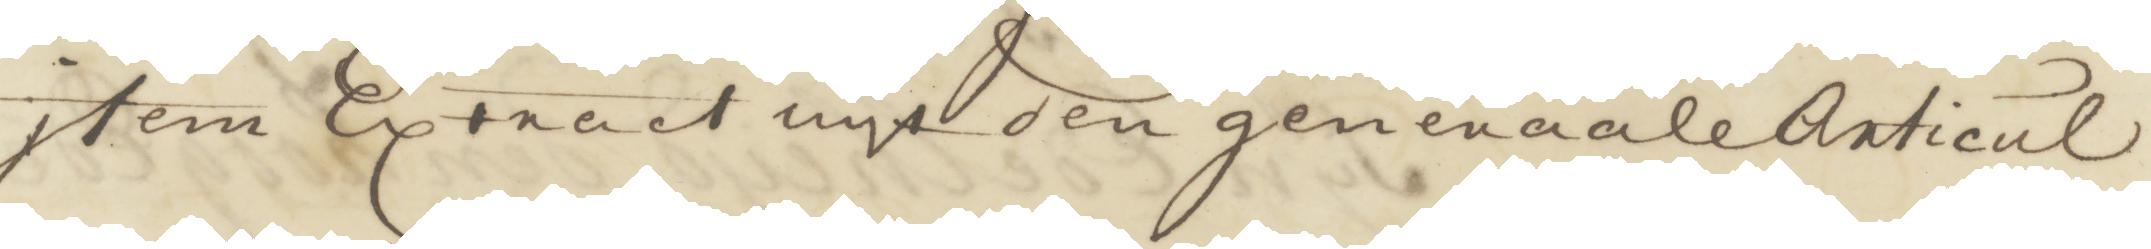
jtem Extract uijt den generaale Articul
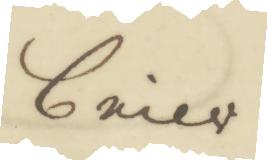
briev
